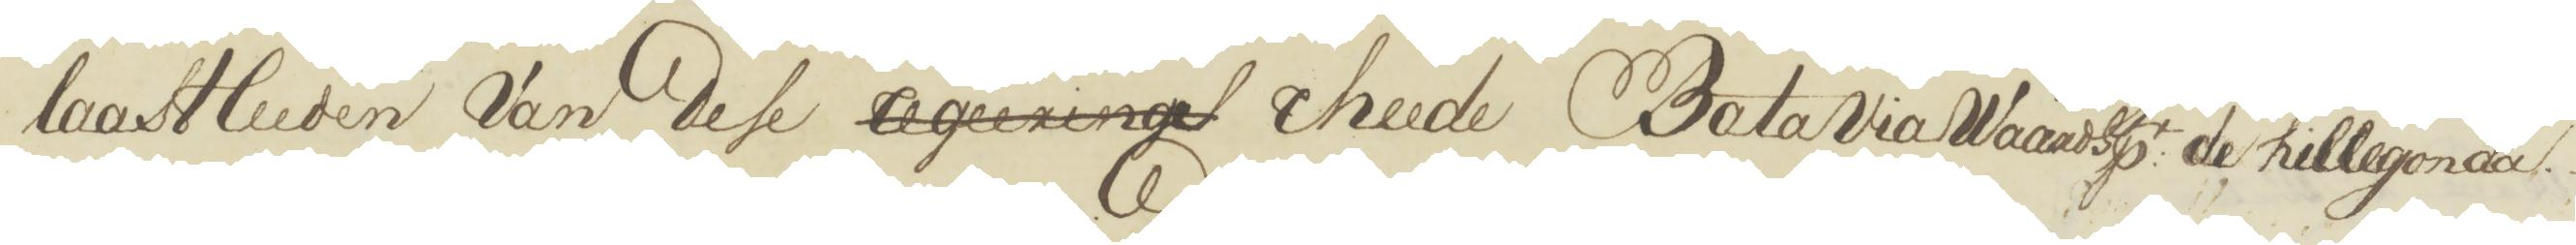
laastleeden van dese regeeringe rheede Bataviawaards p:r de hillegonda.
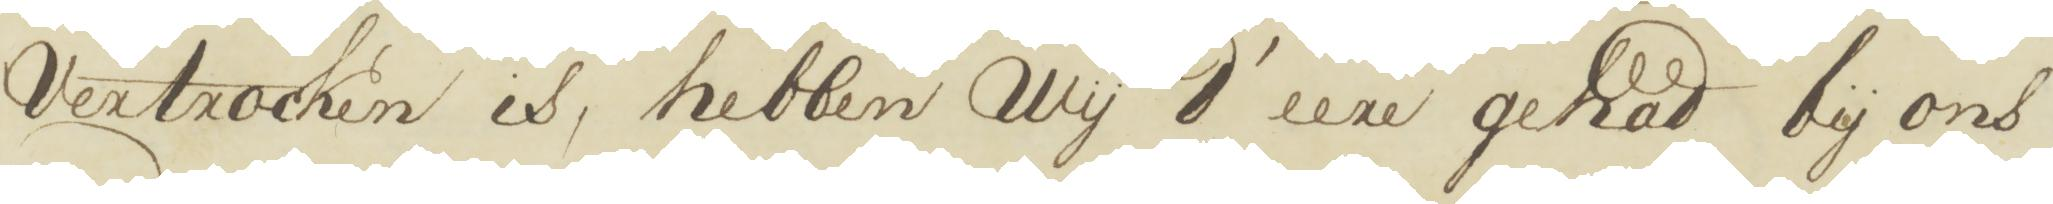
vertrocken is, hebben wij d’ eere gehad bij ons
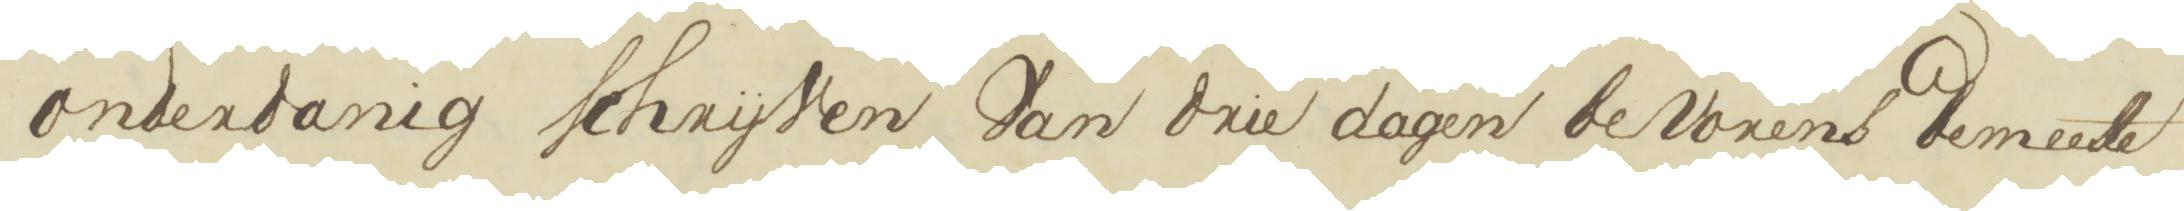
onderdanig schrijven van drie dagen bevorens demeeste
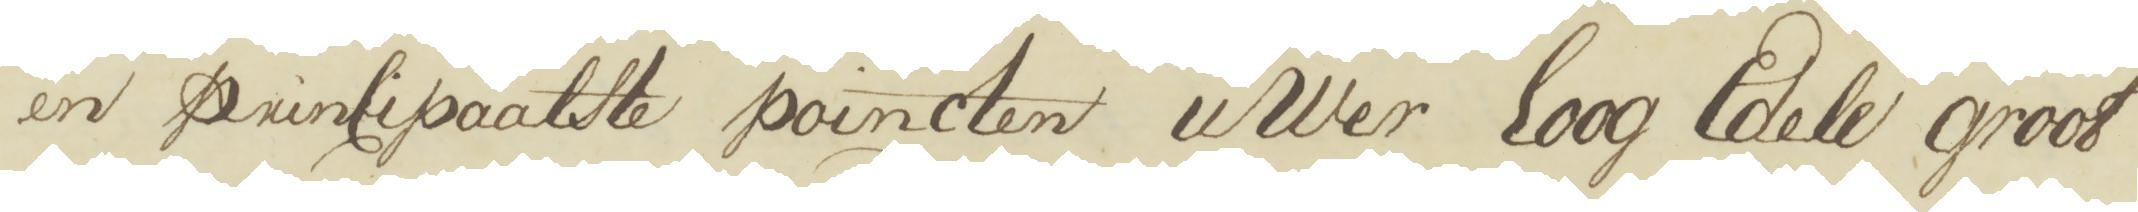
en principaalste poincten uwer hoog Edele groot
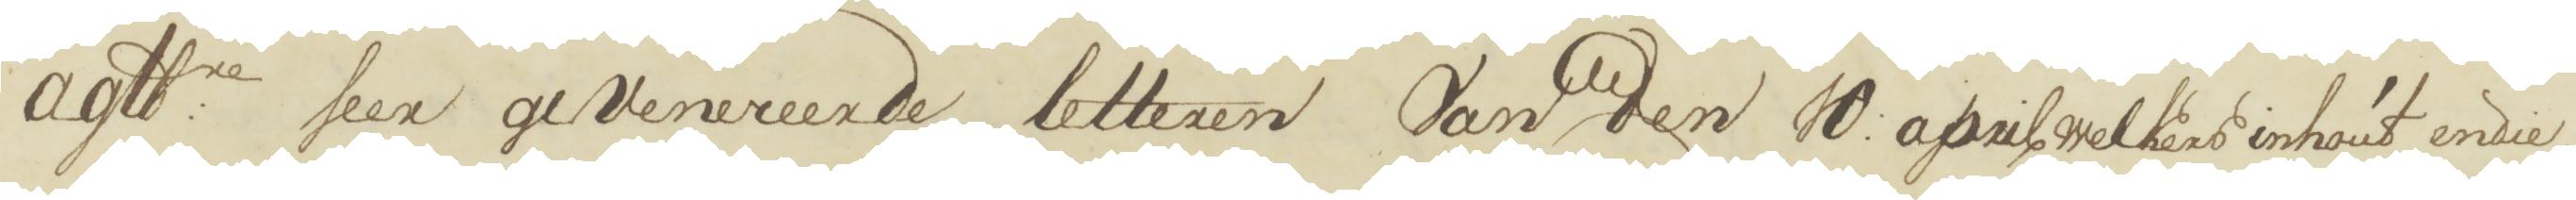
agtb:re seer gevenereerde letteren van den 10: april welkers inhout endie
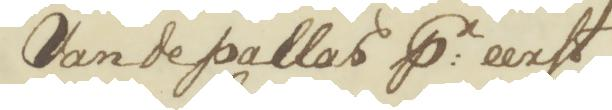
van de pallas p:r eerst
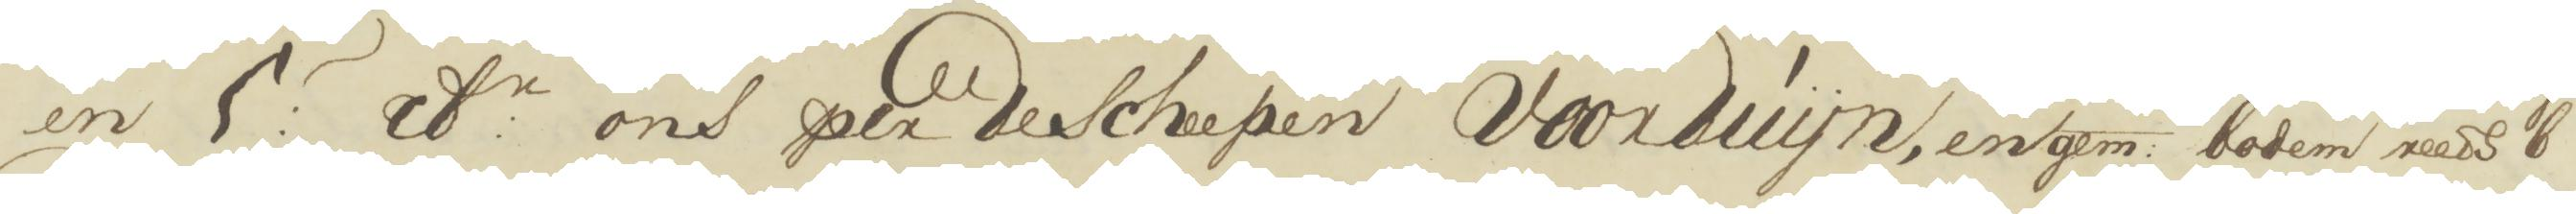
en 5:' rb:r ons per de scheepen Voorduijn, en gem: bodem reeds b'
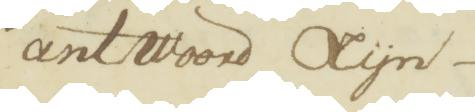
antwoord zijn
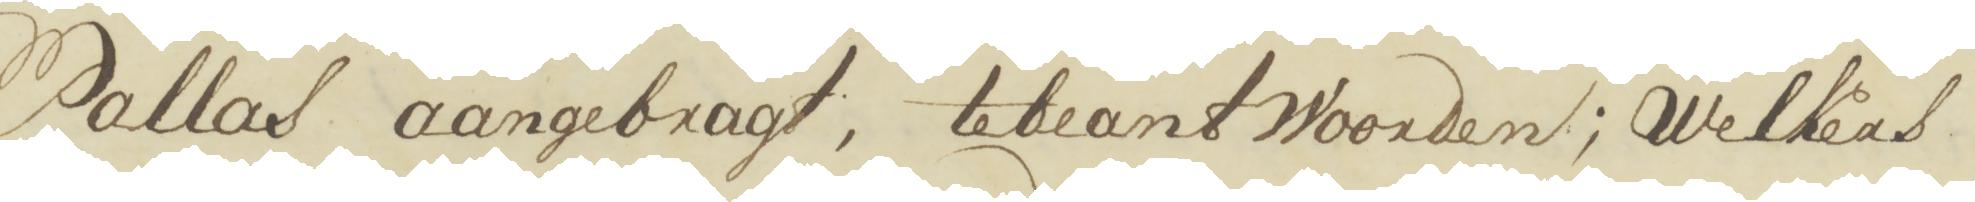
Pallas aangebragt, te beantwoorden; welkers
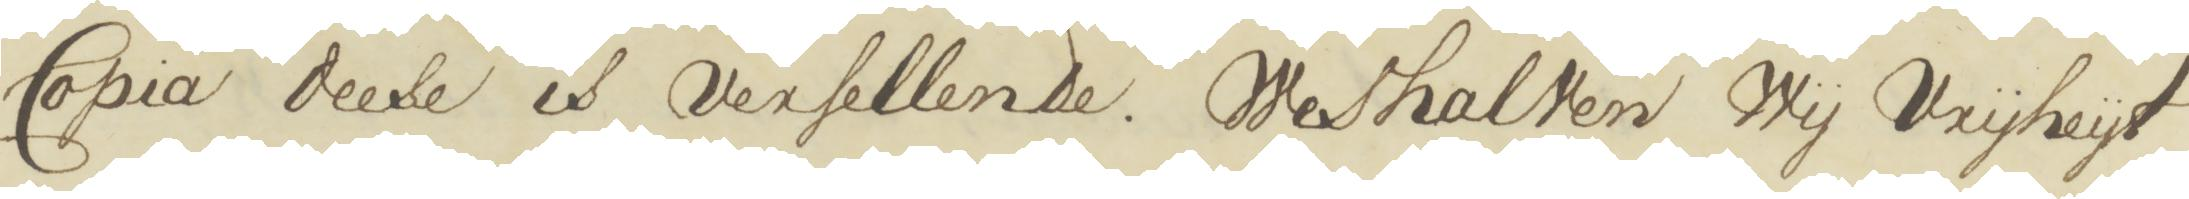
Copia deese is versellende. Weshalven Wij Vrijheijt
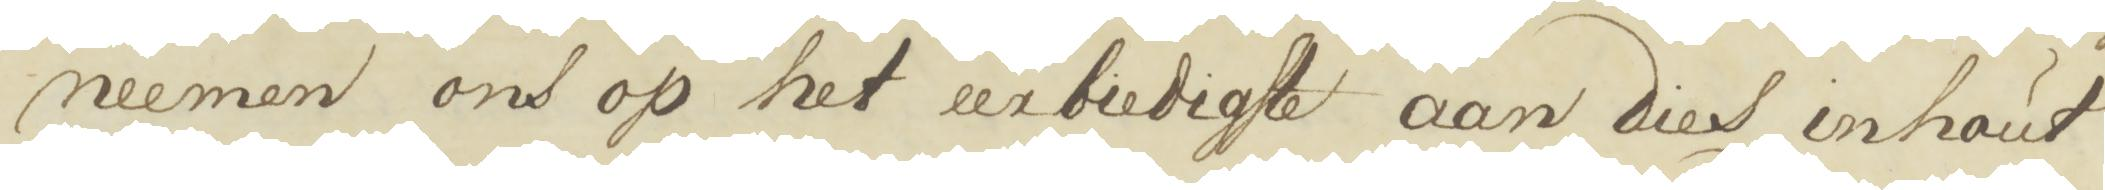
neemen ons op het eerbiedigste aan dies inhout
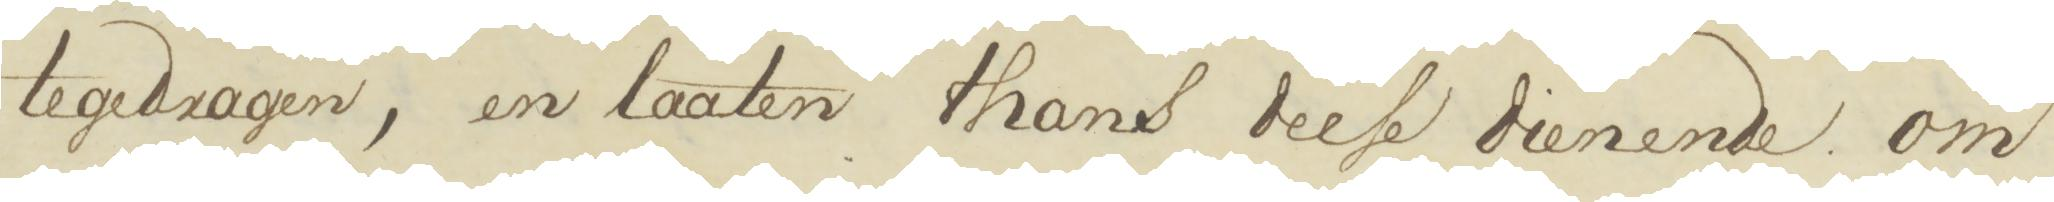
te gedragen, en laaten thans deese dienende om
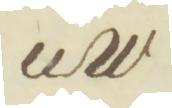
uw
